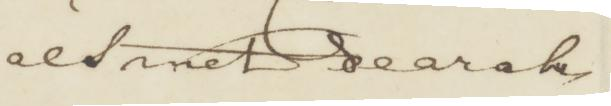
als met de arak
